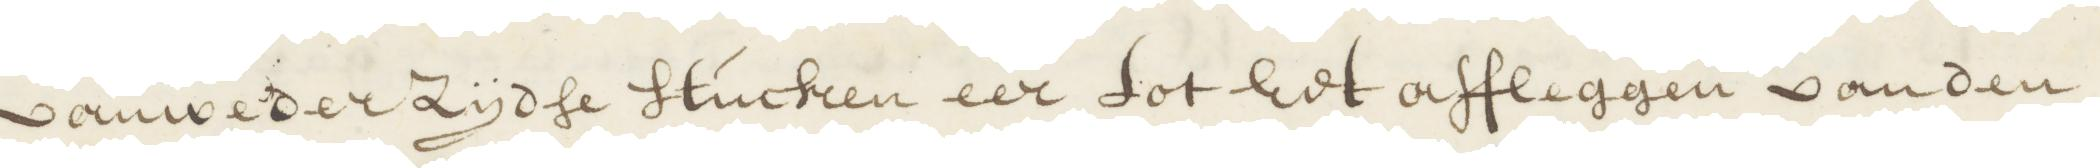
vanweder Zijdse stucken eer tot het affleggen van den
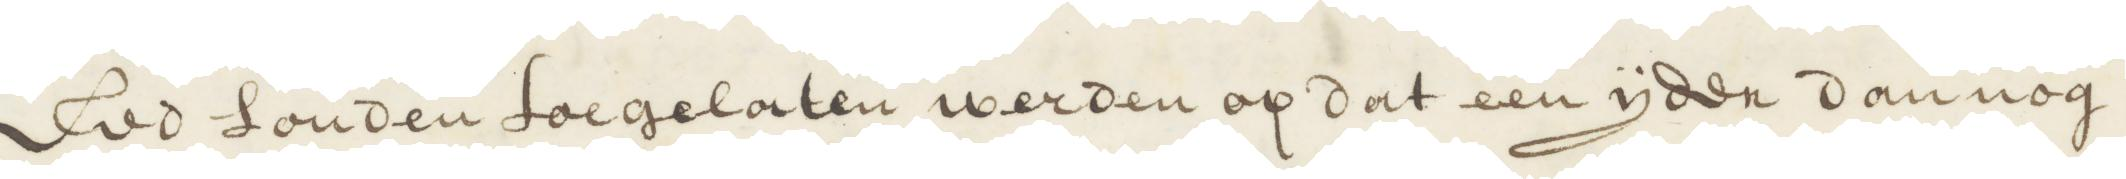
Eed souden toegelaten werden op dat een ijder dan nog
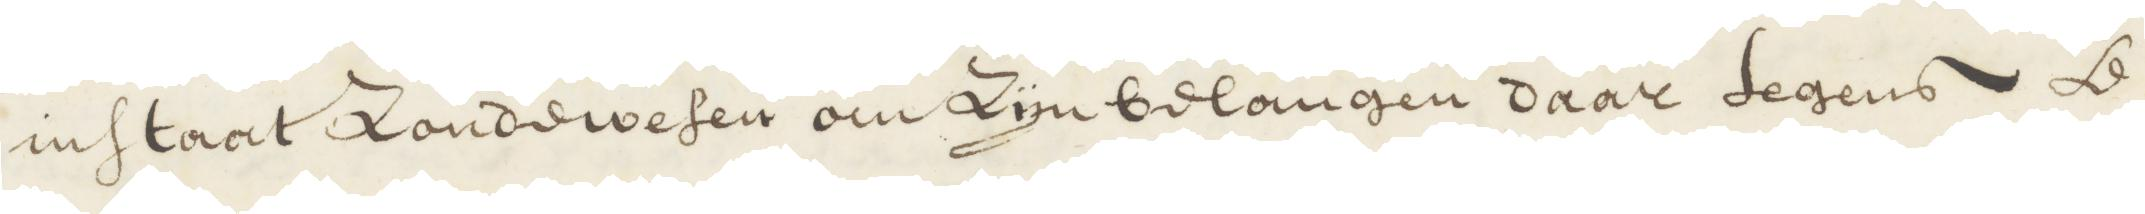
instaat Zoudewesen om Zijn belangen daar tegens te
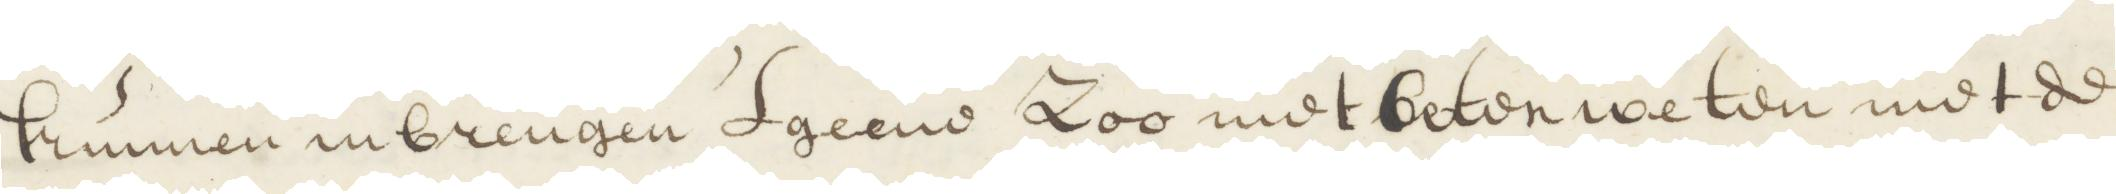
kunnen in brengen 't geene zoo niet beter weten met de
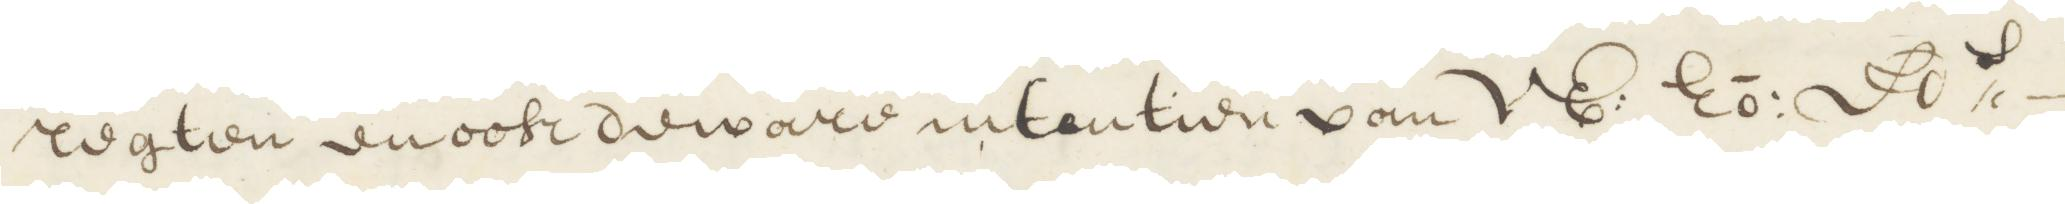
regten en ook deware intentien van U E: ho: Ed„s
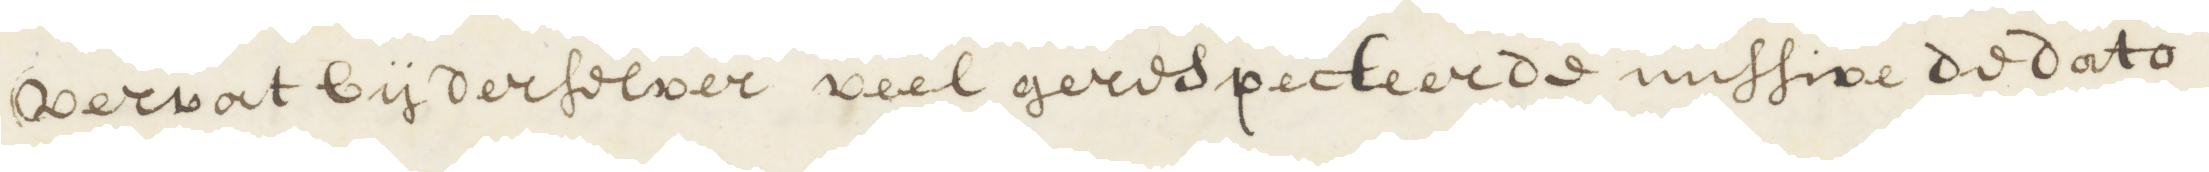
vervat bij derselver veel gerespecteerde missive de dato
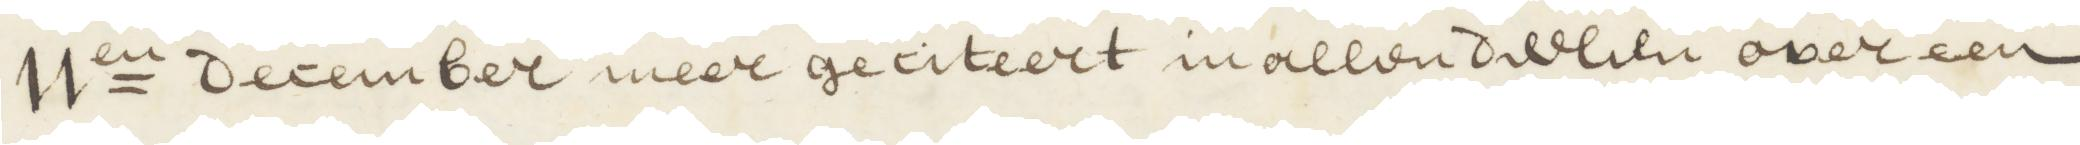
11= en december meer geciteert in allen deelen over een
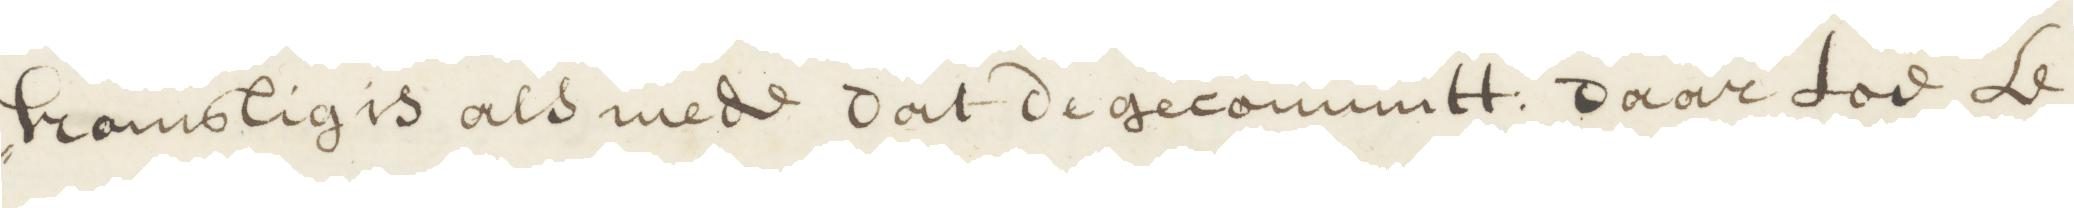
„komstig is als mede dat de gecommitt:s daar toe te
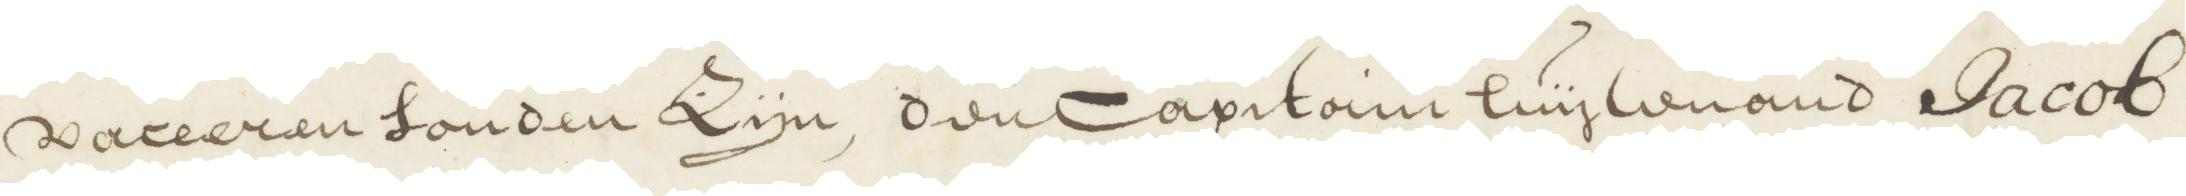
vaceeren souden Zijn, den Capitain luijtenand Jacob
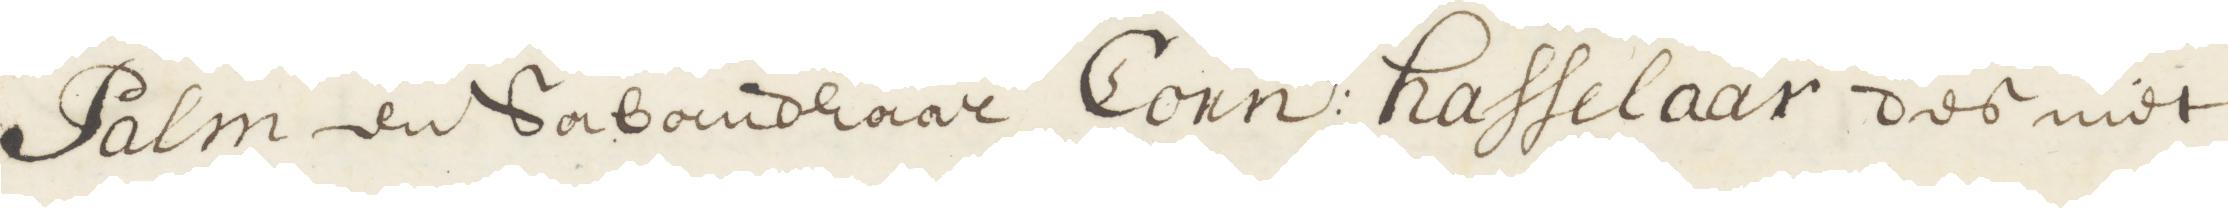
Palm en Sabandhaar Corn: hasselaar des niet
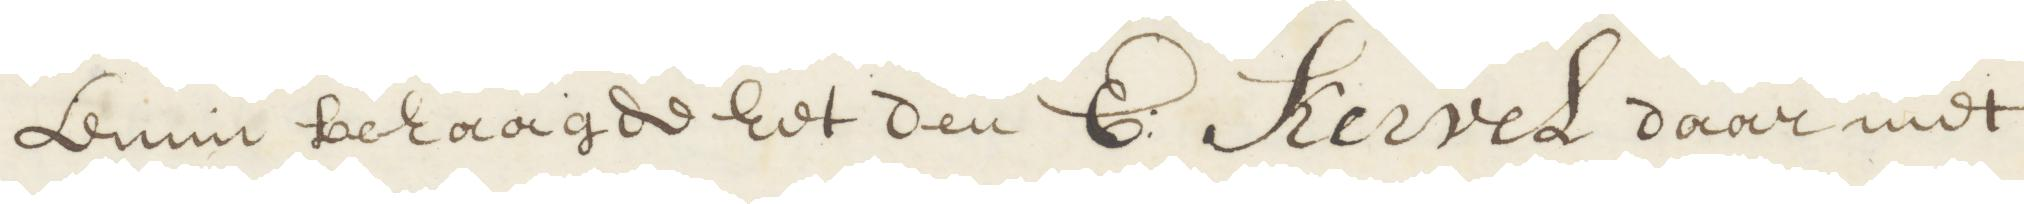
temin behaagde het den E: kervel daar niet
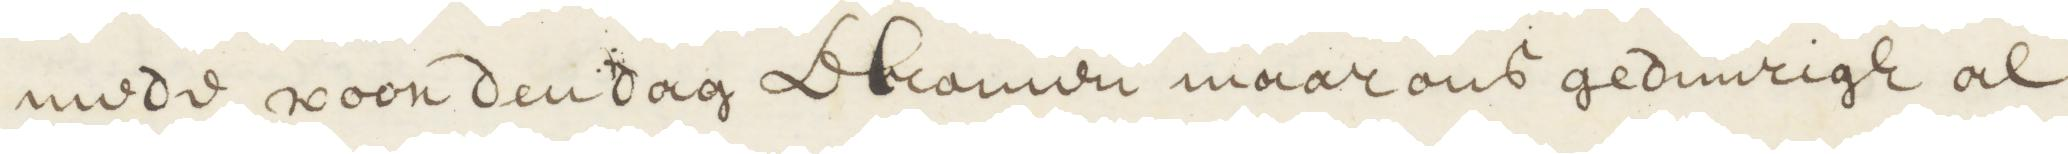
mede voor den dag tekomen maar ons geduurigh al
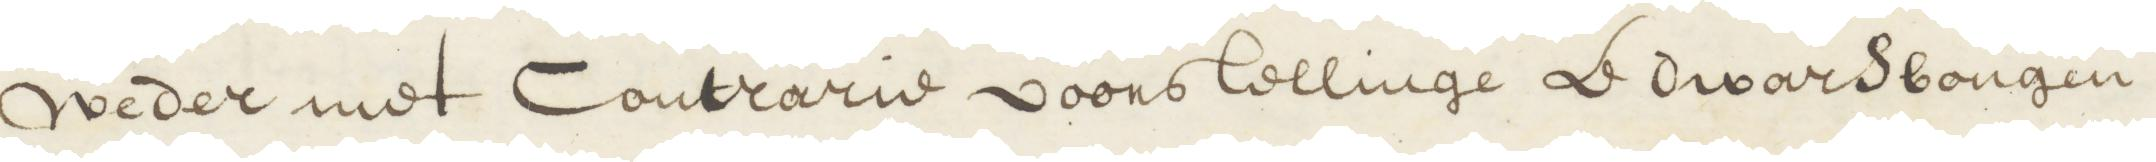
weder met Contrarie voorstellinge te dwarsbougen
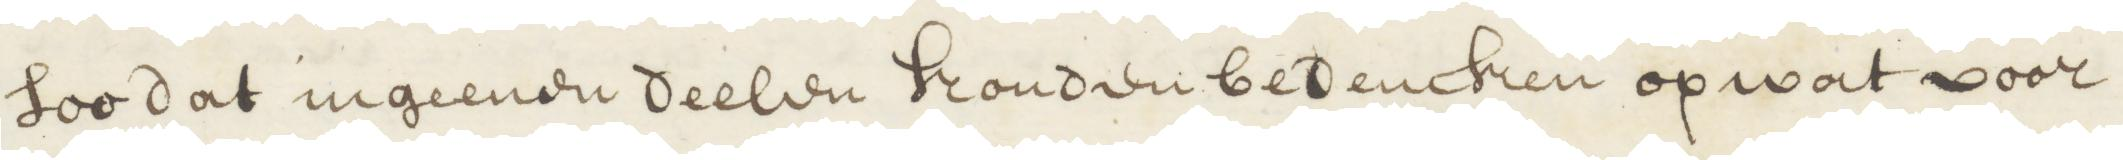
soo dat ingeenen deelen konden bedencken op wat voor
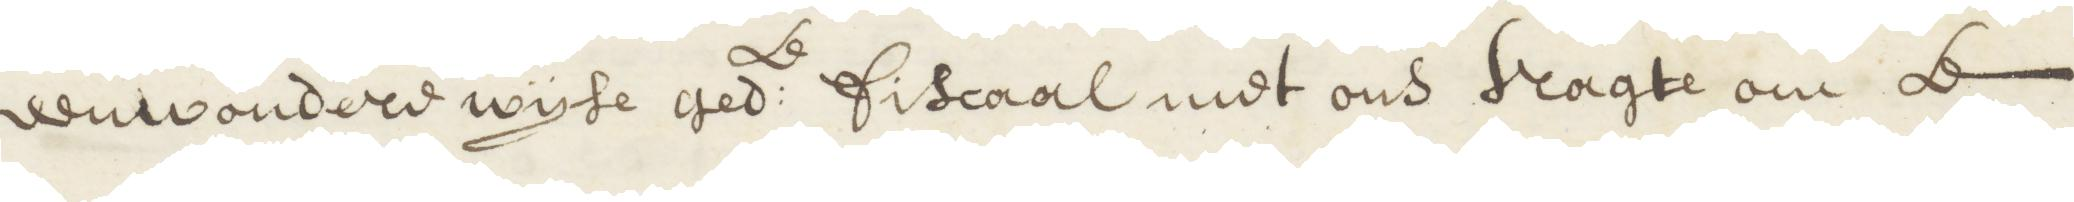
eenwondere wijse ged:te fiscaal met ons tragte om te
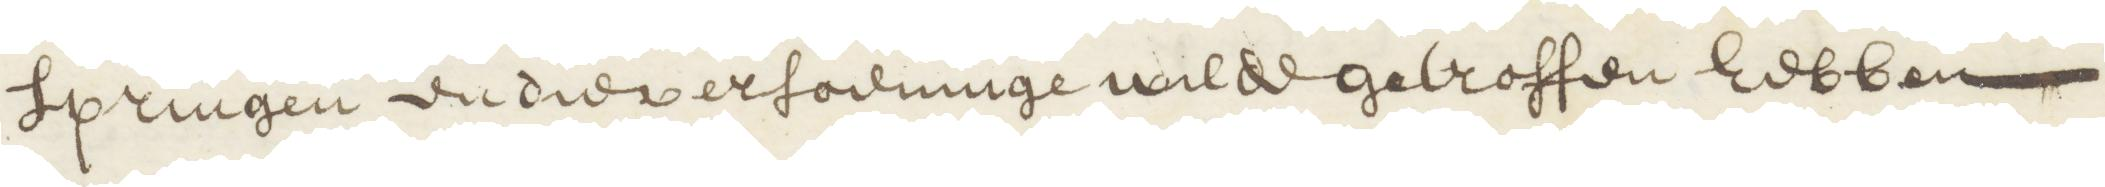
springen en dieversoeninge wilde getroffen hebben
